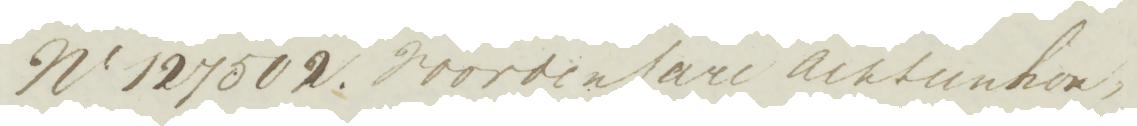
No 127502. voor den jare achtenhon127502. Voordentare Achtenhou„
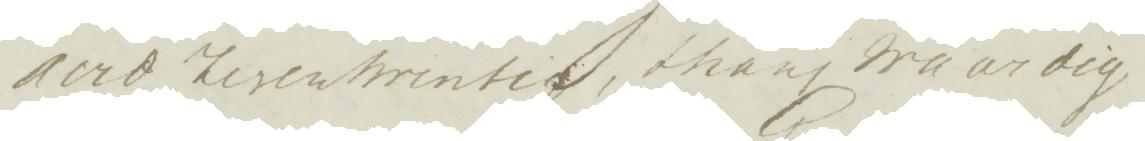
derd Zegentwintig, thang waardig,
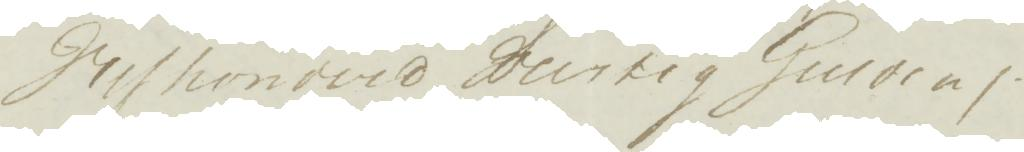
Vjfhonderd Derstig Guiden /.
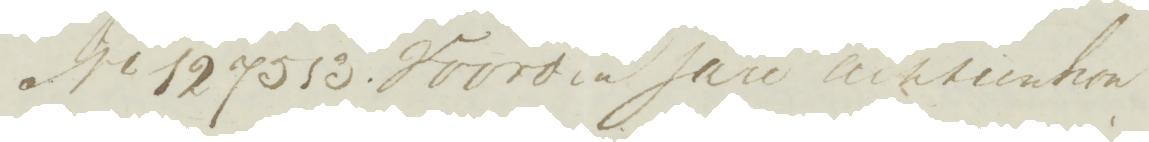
N=o 127513. Voordin Jare achtienhon„
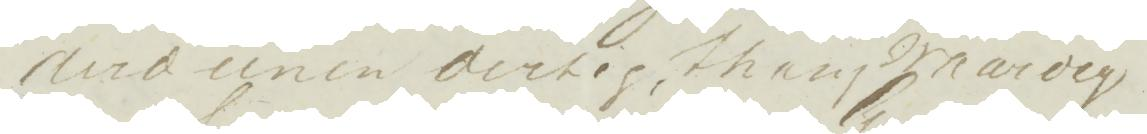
derd een en dertig, thans waardig
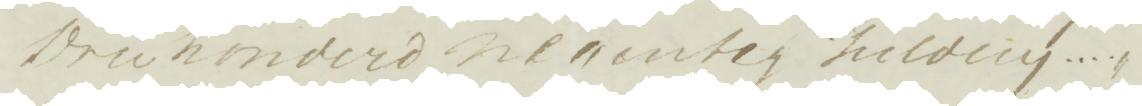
Drie honderd negentig schuldig . . . .„
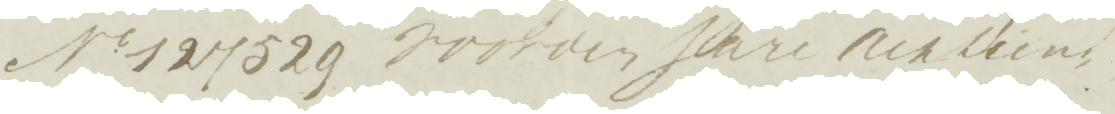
N.o 127529 voor den Jare achtien„
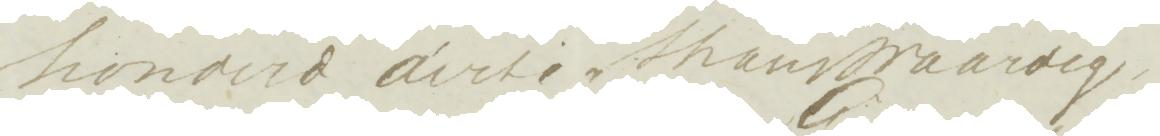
honderd dertig thans waardig,
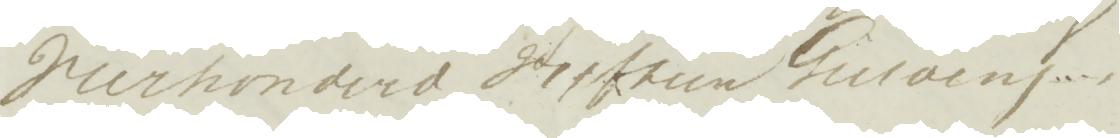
Vierhonderd Vyftien Guldens . . .,
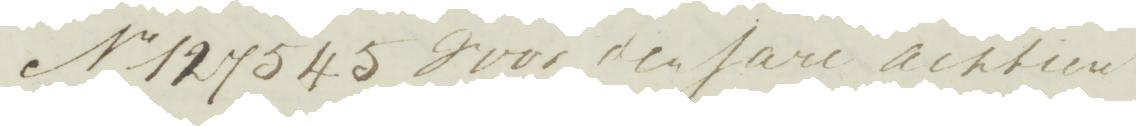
No 127545 voor den jare achtien
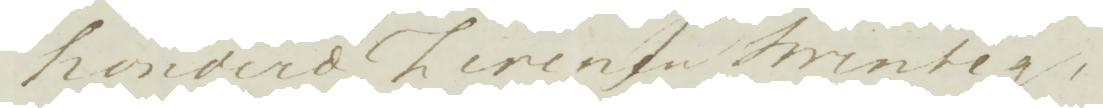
honderd zeven en twintig,
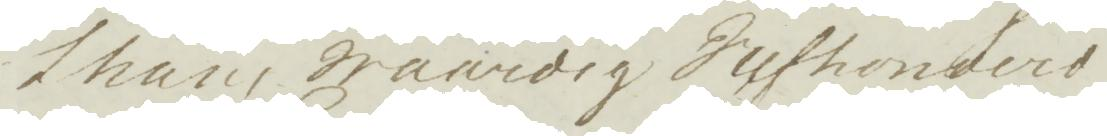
thans, waardig vyfhonderd
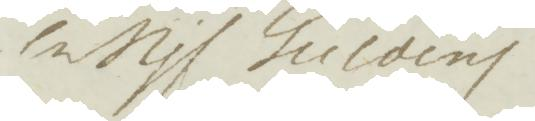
en vijf Guldens
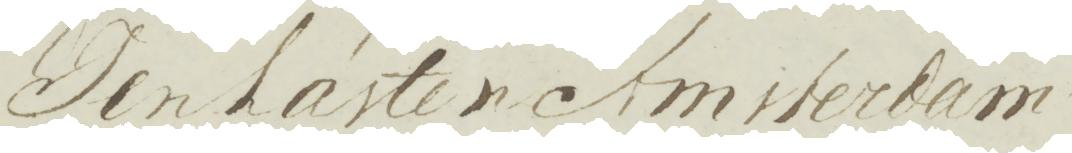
Ten Lasten Amsterdam
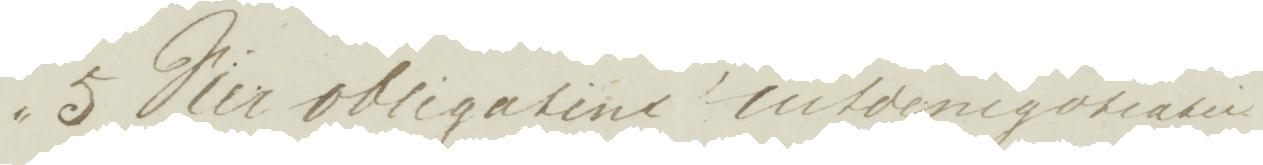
„ 5 Vier obligative uit de negotiatie
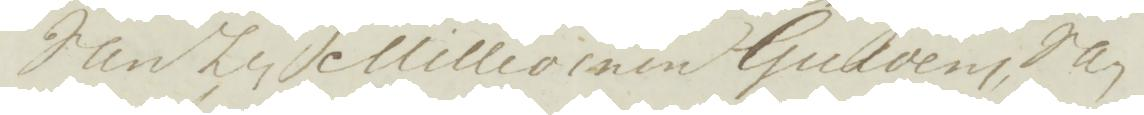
Van zes millioenen Guldens, van
